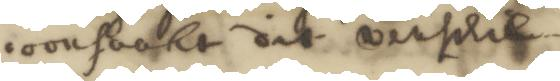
oorsaakt dit verschil
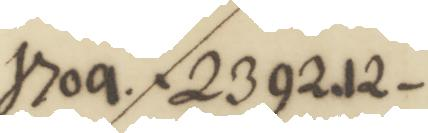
1704. ƒ2392.12-
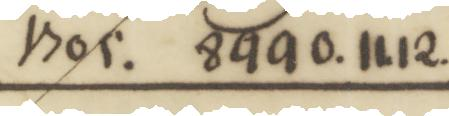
1705. 8440.11.12.
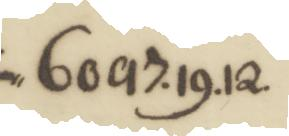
„ 6047.19.12.
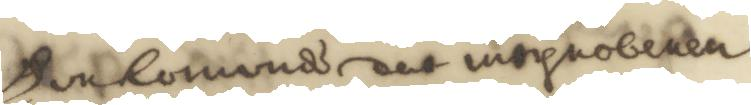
Her komende dat in proberen
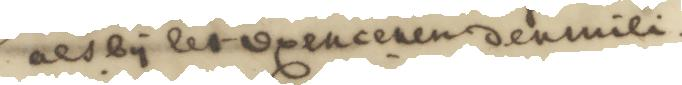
als bij het exerceren dermili
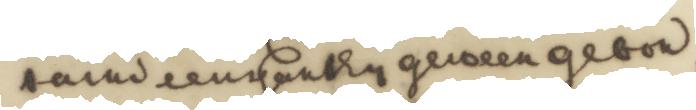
taire eenparthij geweer gebor
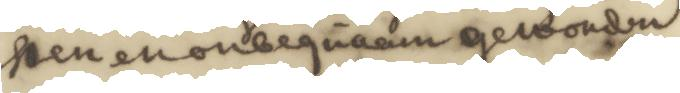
sten en onbequaam geworden
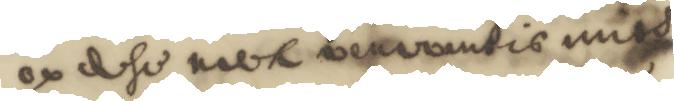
op dese reek verwant is mits
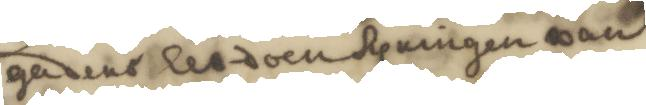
gaders het doen springen van
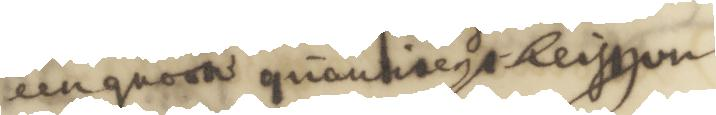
een groote quantiteijt keijyen
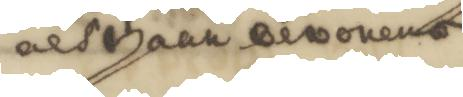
als tjaar bevorens
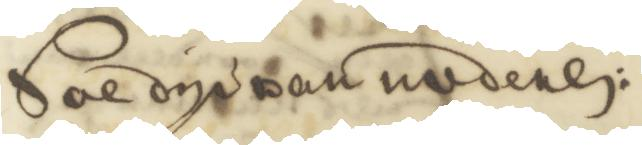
sol dije van nederl:
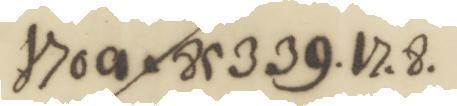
1704 ƒ85339.17.8.
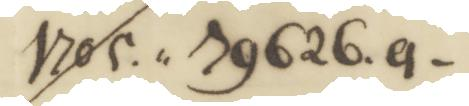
1705.„ 79626.9-
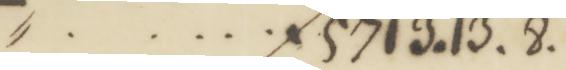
„ - - - - - f 5713.13. 8
